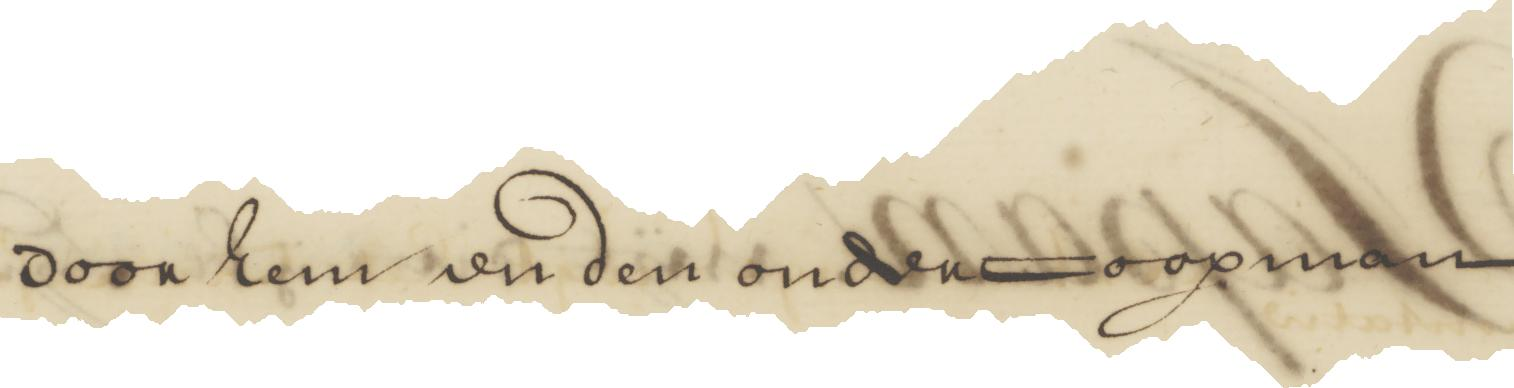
door hem en den ondercoopman
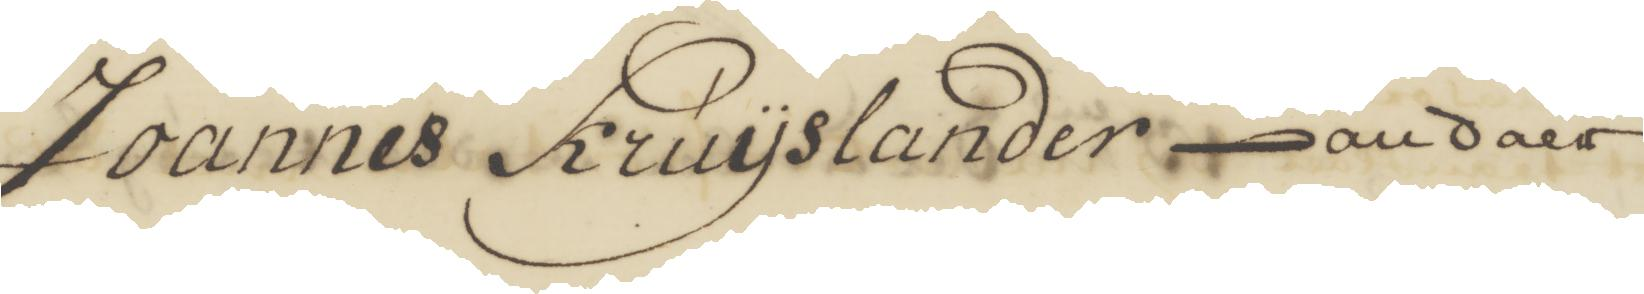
Joannes Kruijslander van daer
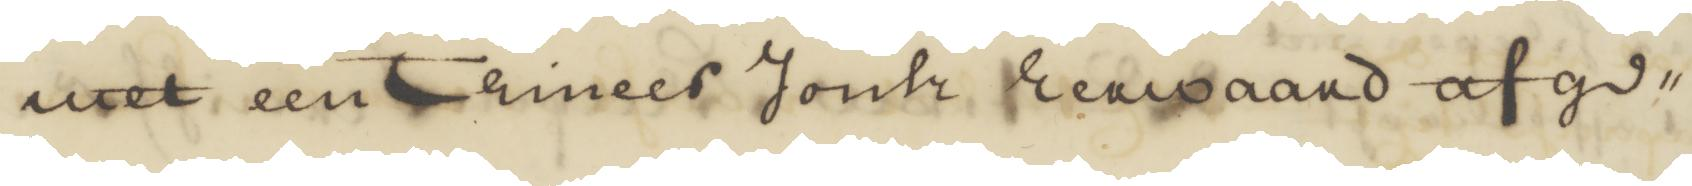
met een Chinees Jonk herwaard afge„
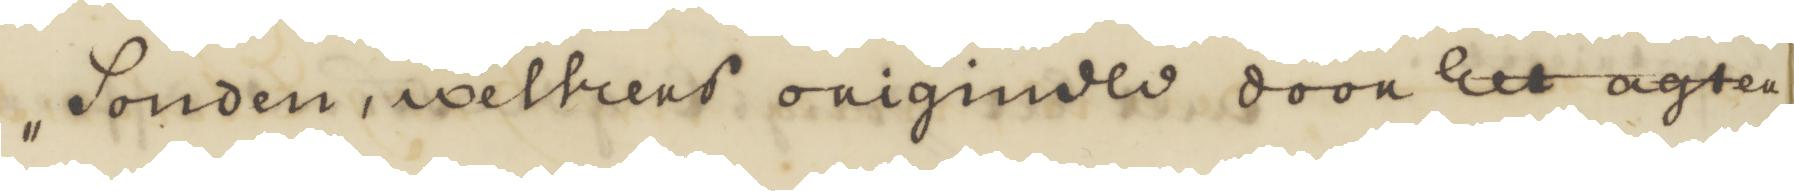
„ sonden, welkers originele door het agter
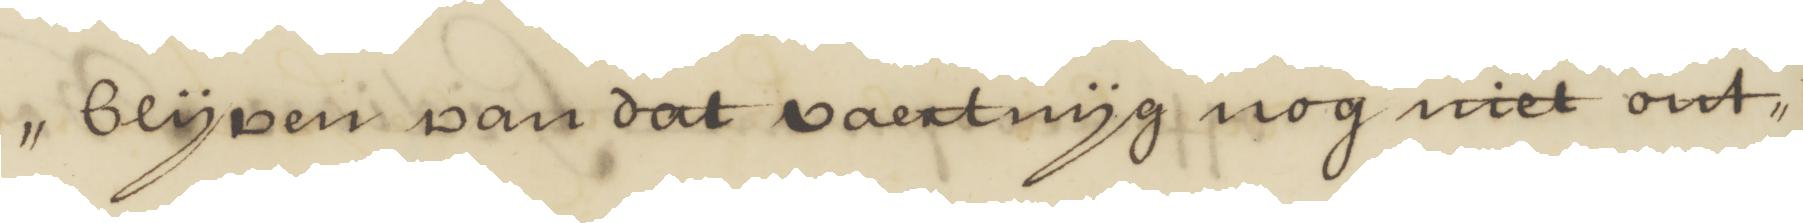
„ blijven van dat vaertuijg nog niet ont„
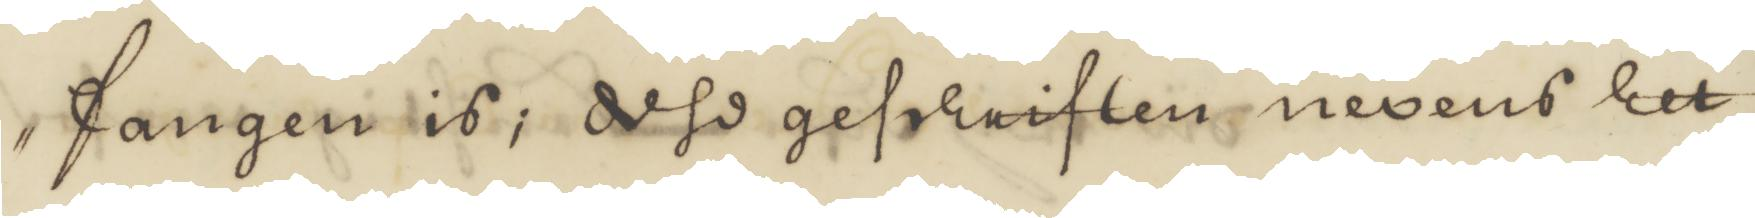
„ fangen is; dese geschriften nevens het
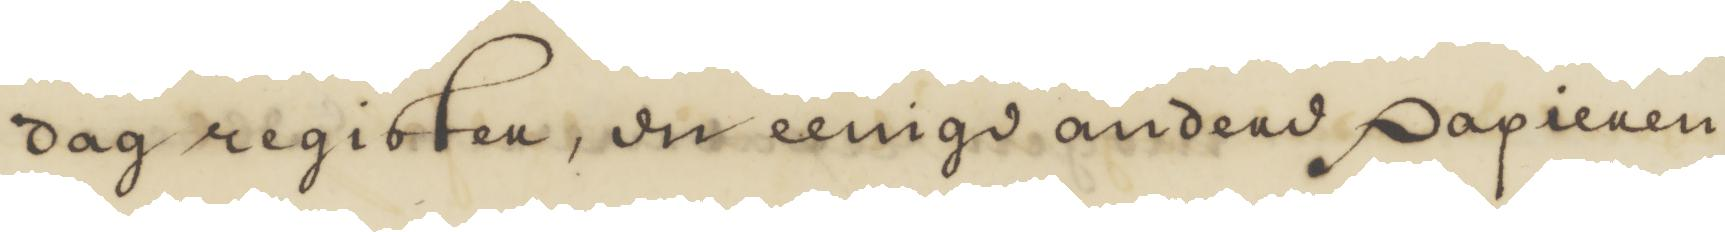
dag register, en eenige andere papieren
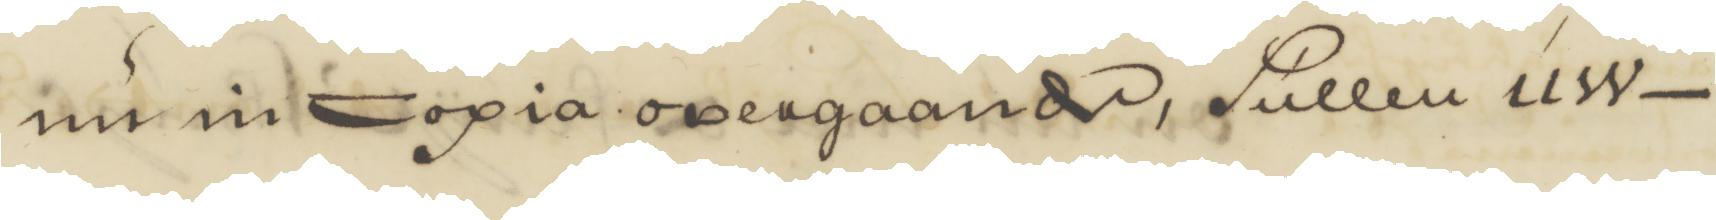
nu in copia overgaande, sullen uw
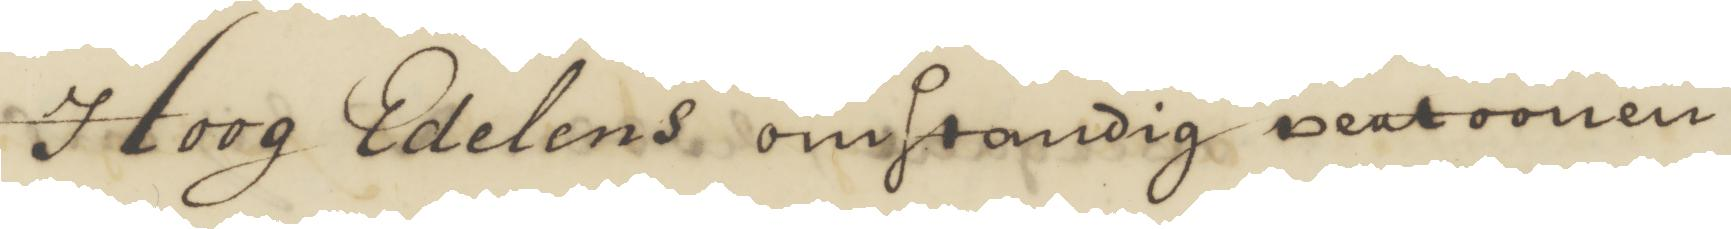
Hoog Edelens omstandig vertoonen
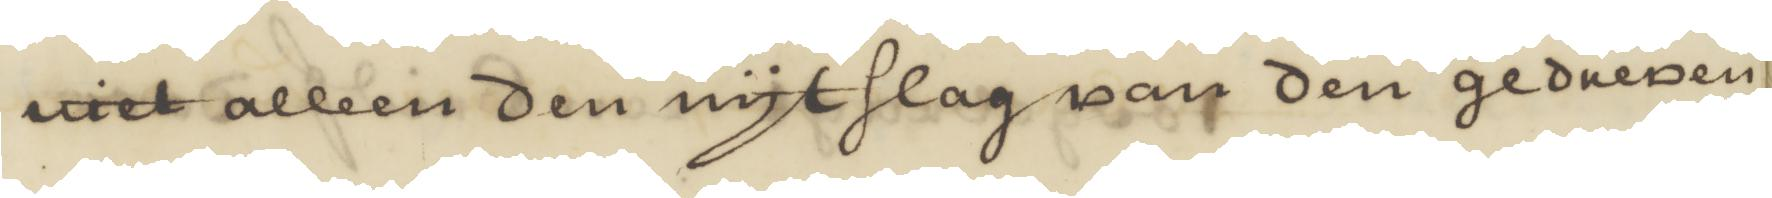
niet alleen den uijtslag van den gedreven
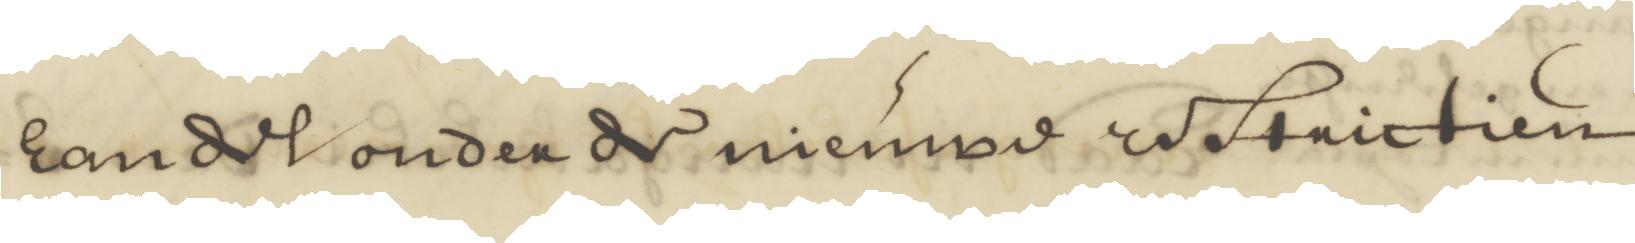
handel onder de nieuwe restrictien
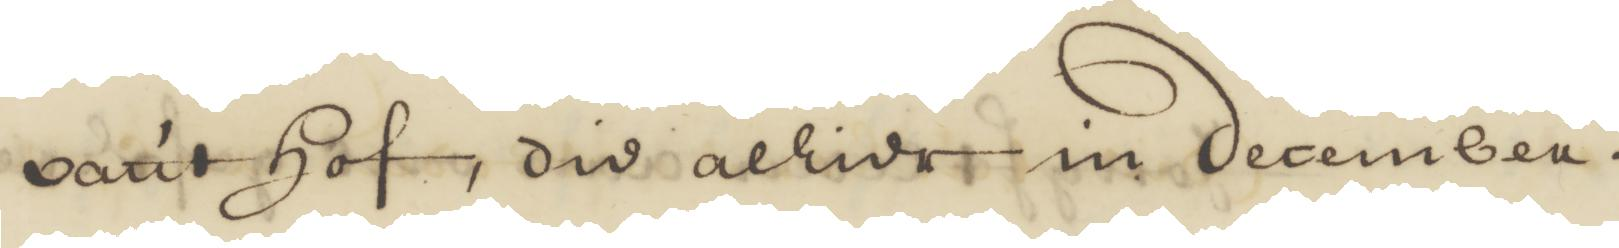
van ’t Hof, die alhier in december
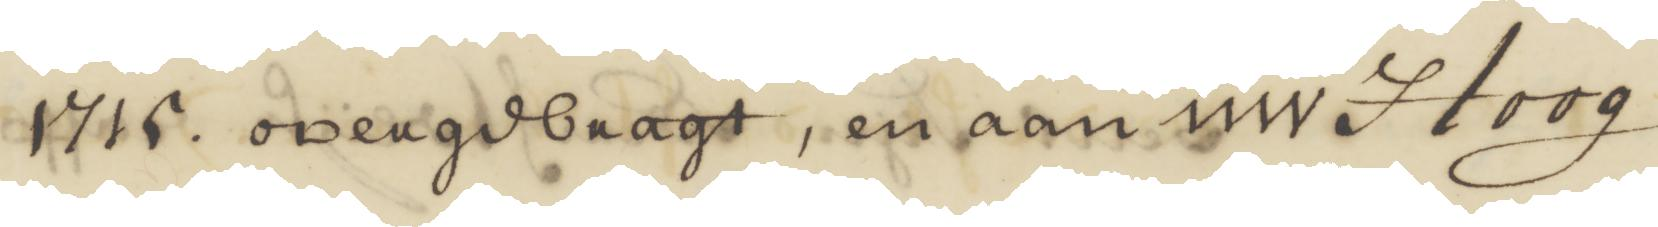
1715. overgebragt, en aan uw Hoog
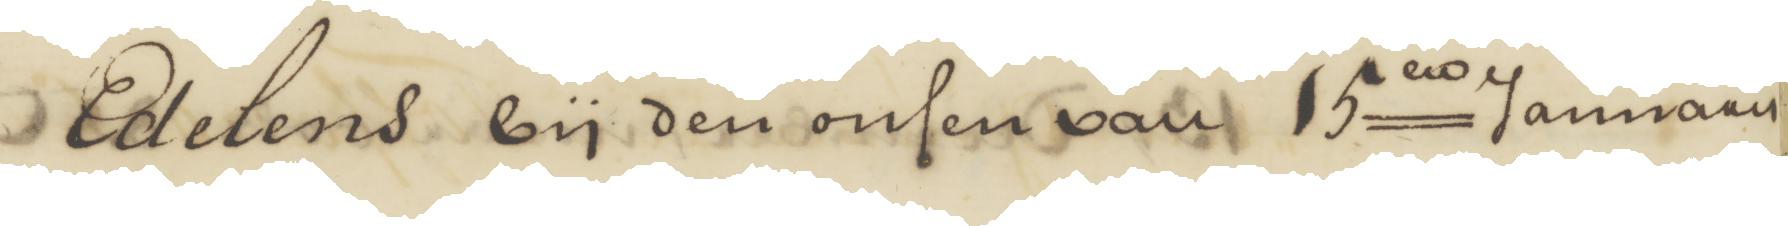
Edelens bij den onsen van 15=en Januarii
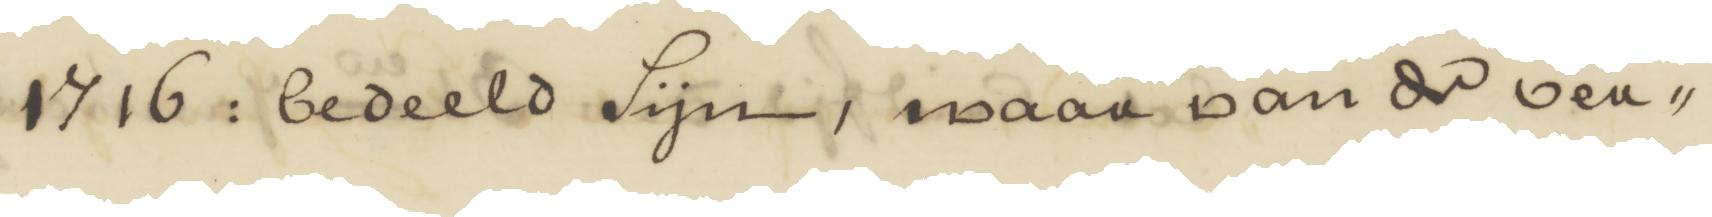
1716: bedeeld sijn, waar van de ver„
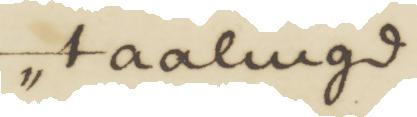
„ taalinge
